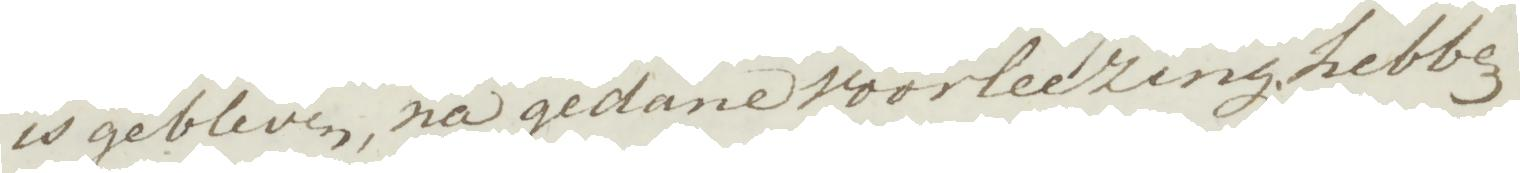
is gebleven, na gedane voorleezing hebben
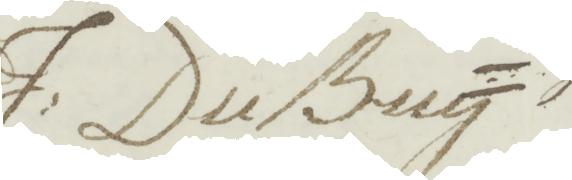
J: Du Buij =
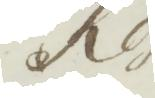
Ko
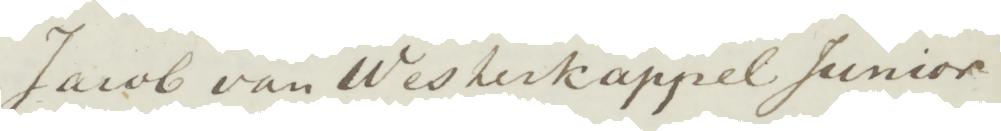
Jacob van Westerkappel Junior
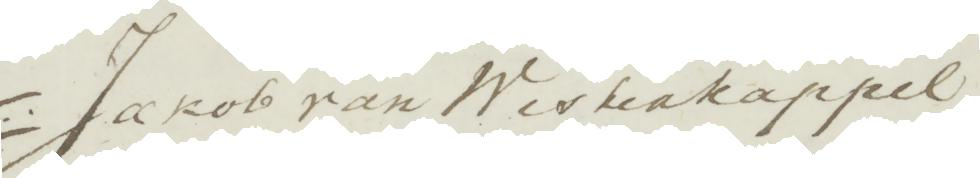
=Jakob van Westerkappel
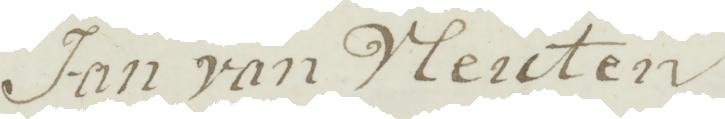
Jan van Vleuten
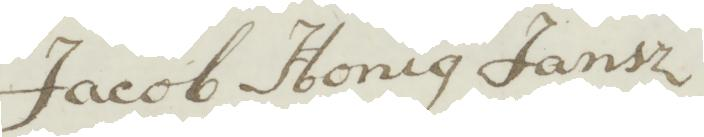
Jacob Honig Jansz
